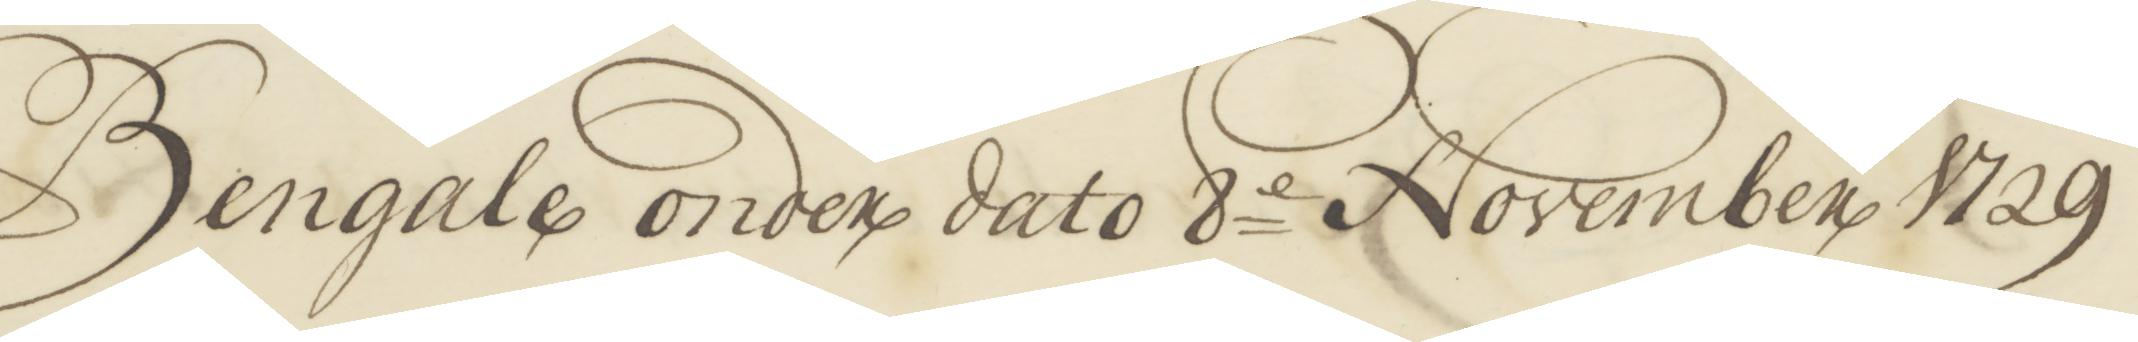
Van Bengale onder dato 8=e November 1729
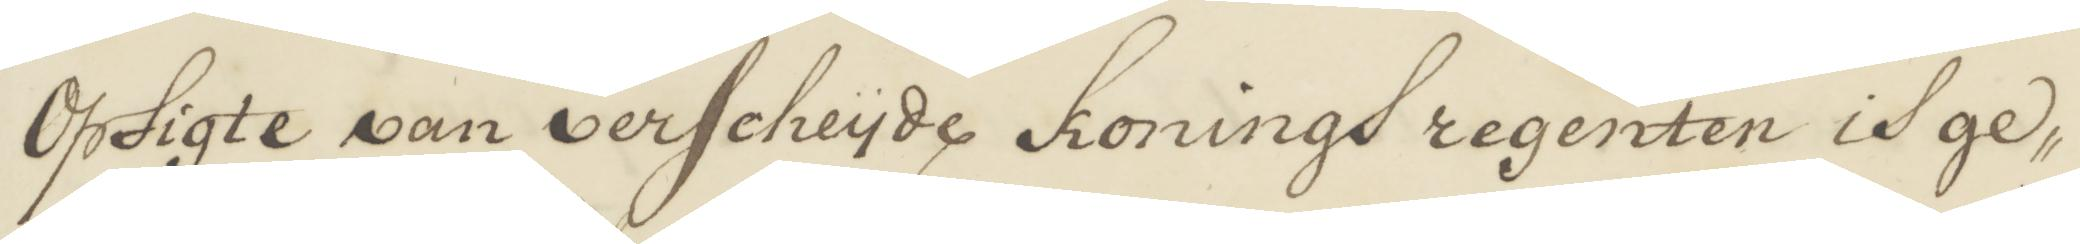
Opsigte van verscheijde konings regenten is ge„
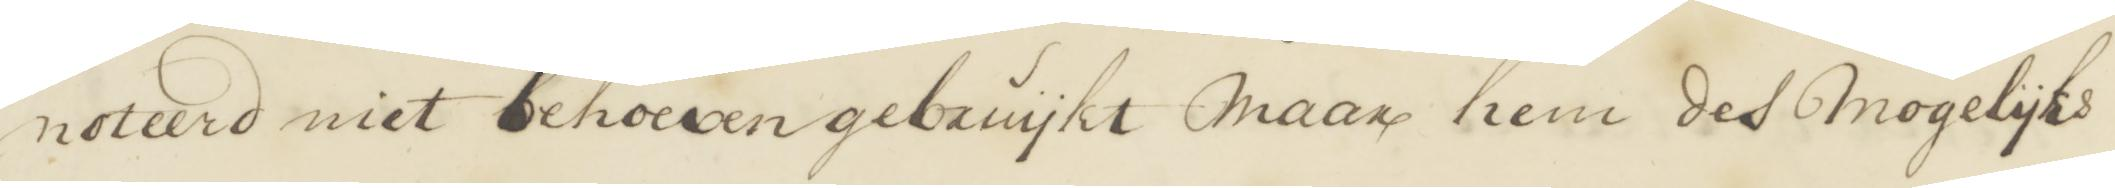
noteerd niet behoeven gebruijkt maar hem des mogelijks
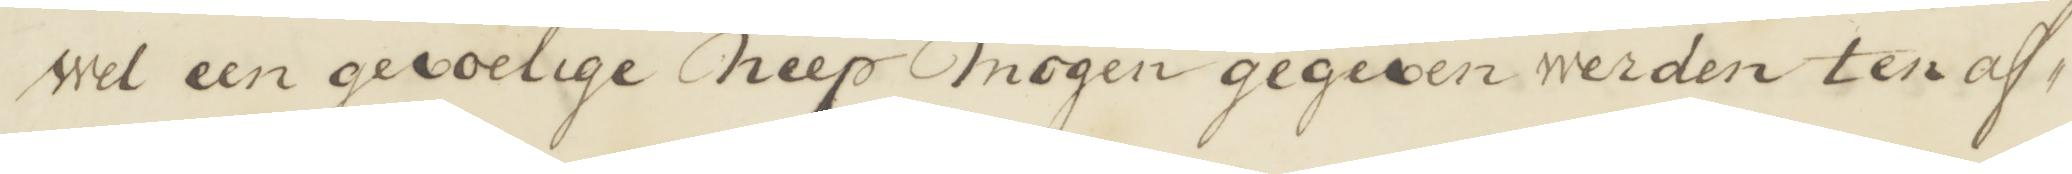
wel een gevoelige neep mogen gegeven werden ten af„
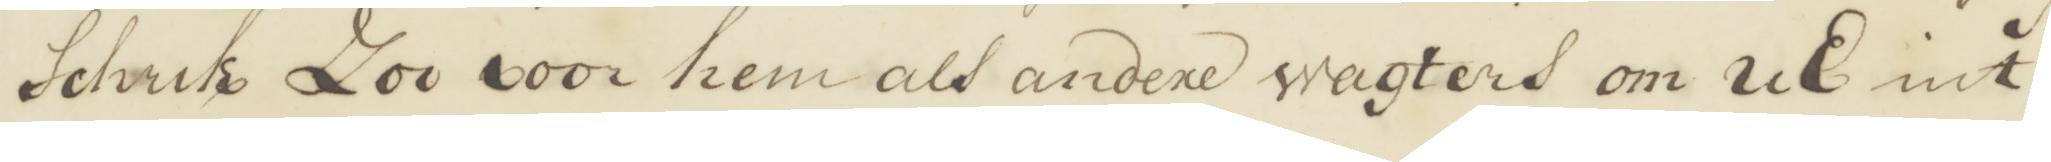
schrik zoo voor hem als andere wagters om uE in’t
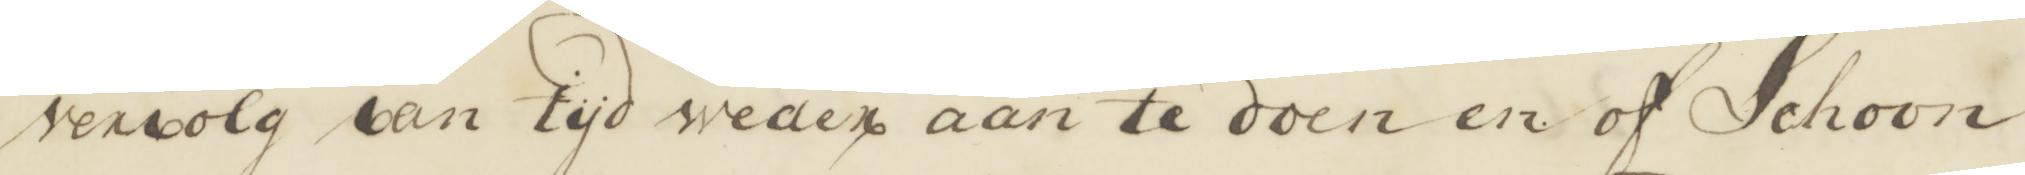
vervolg van tijd weder aan te doen en of Schoon
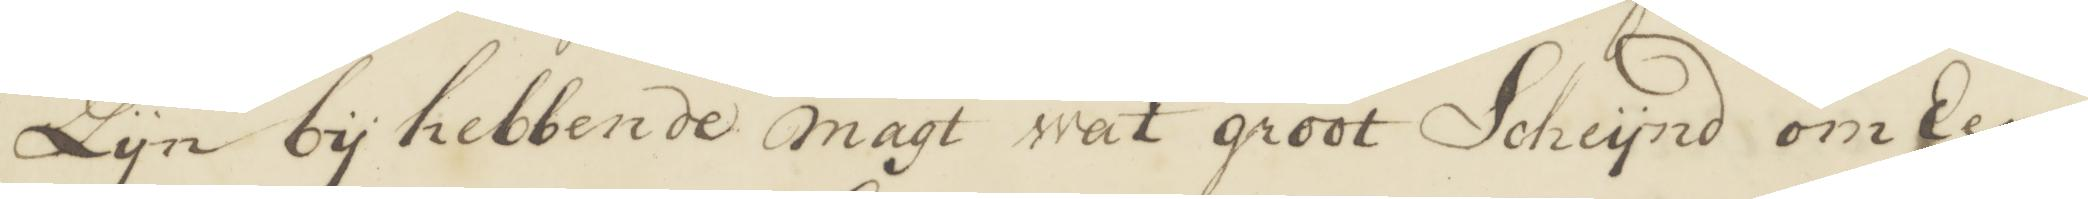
zijn bij hebbende magt wat groot Scheijnd om Een
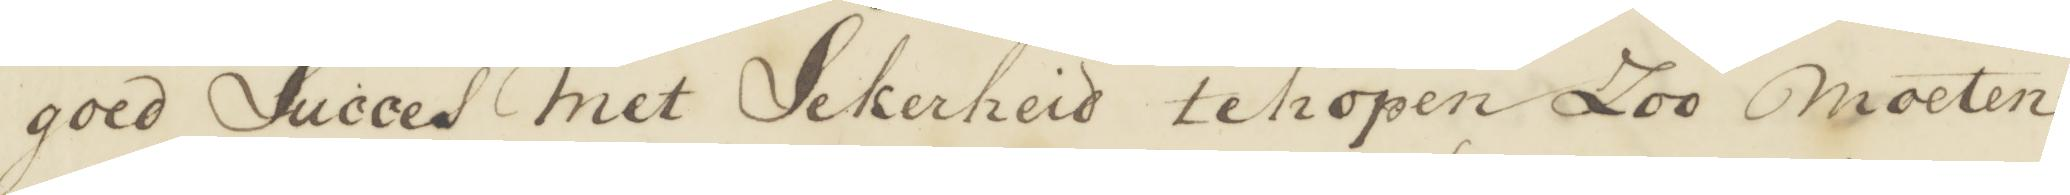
goed Succes met Sekerheid te hopen zoo moeten
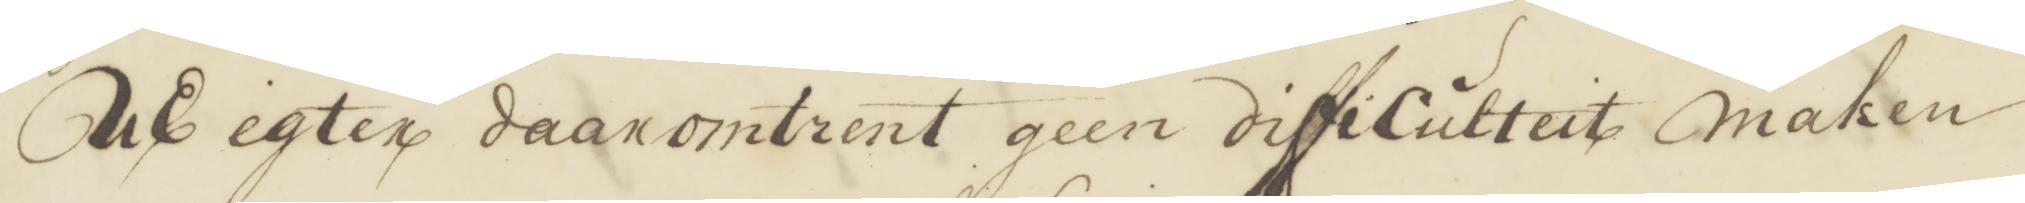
UE egter daaromtrent geen difficulteit maken
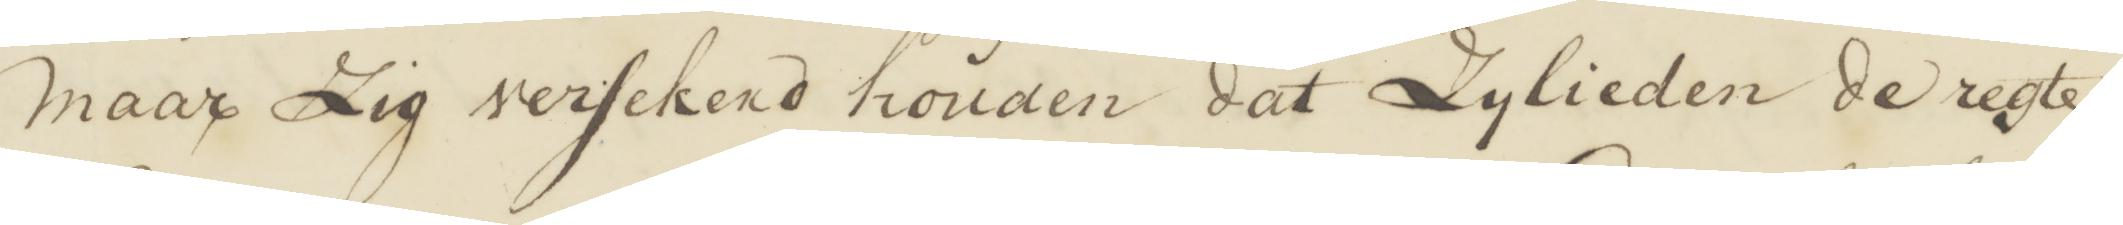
maar zig versekerd houden dat zylieden de regte
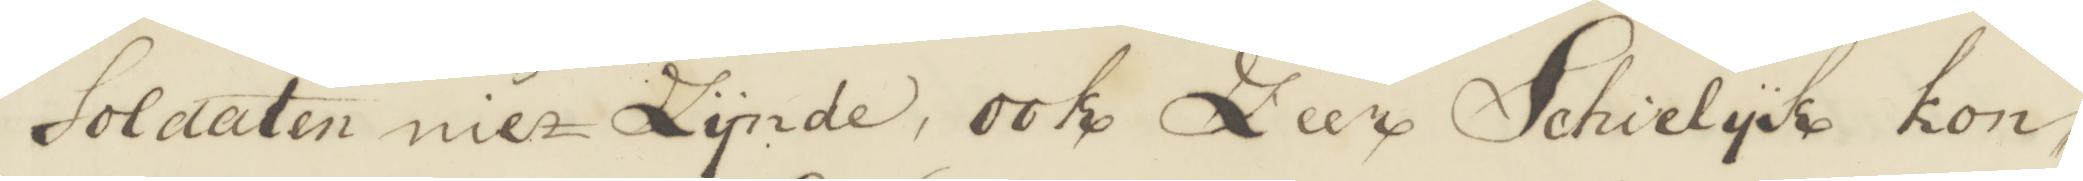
soldaten niet zijnde, ook zeer schielijk kon„
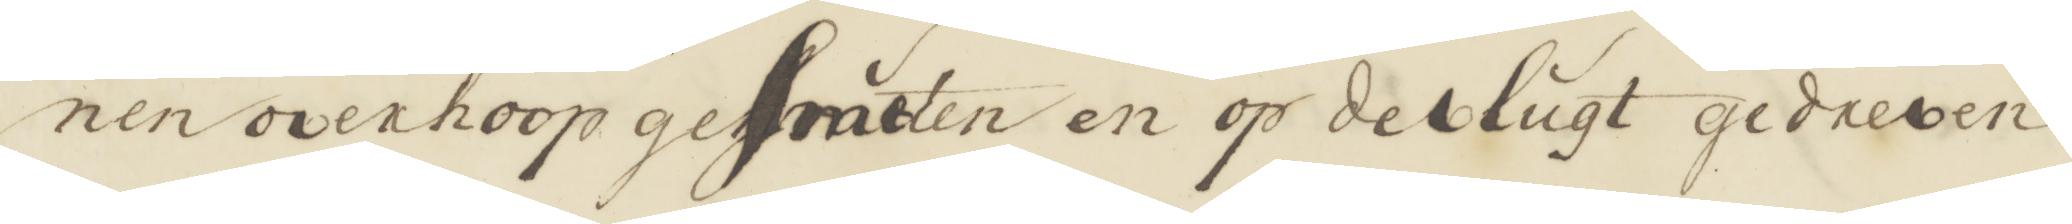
nen overhoop gesmeten en op de vlugt gedreven
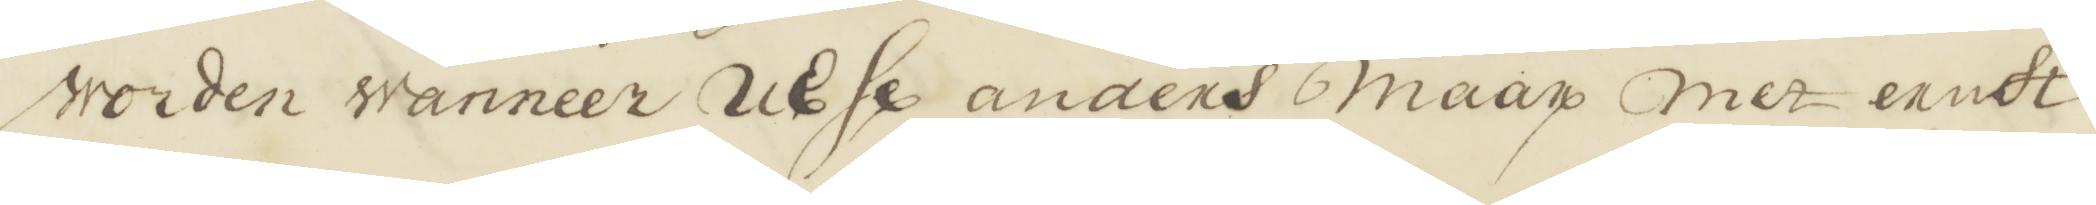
worden wanneer UE se anders maar met ernst
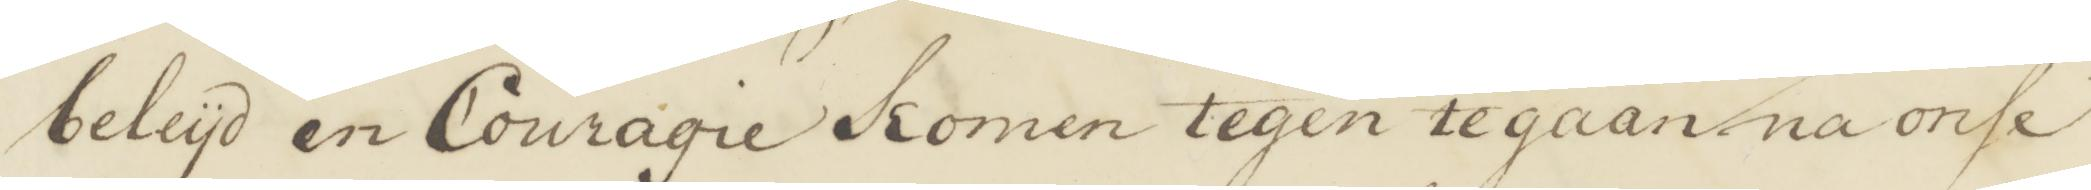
beleijd en Couragie komen tegen te gaan na onse
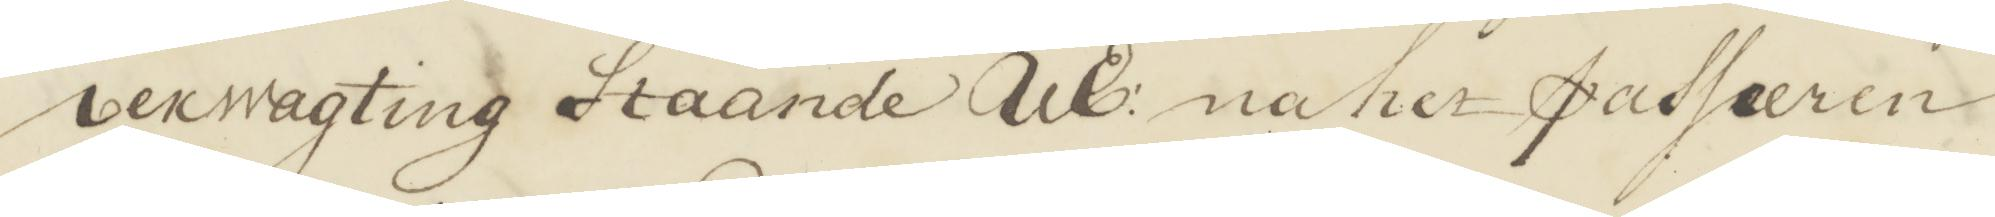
verwagting staande UE: na het passeeren
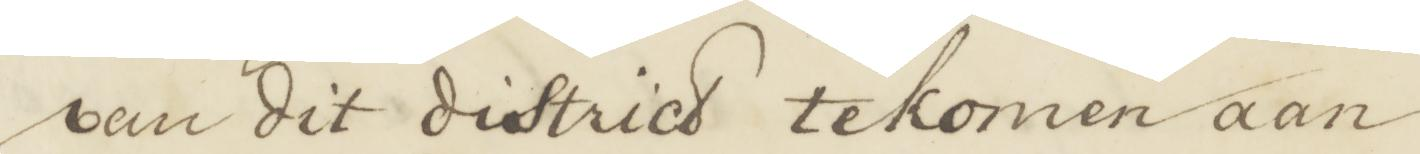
van dit district te komen aan
